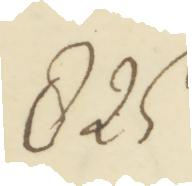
825
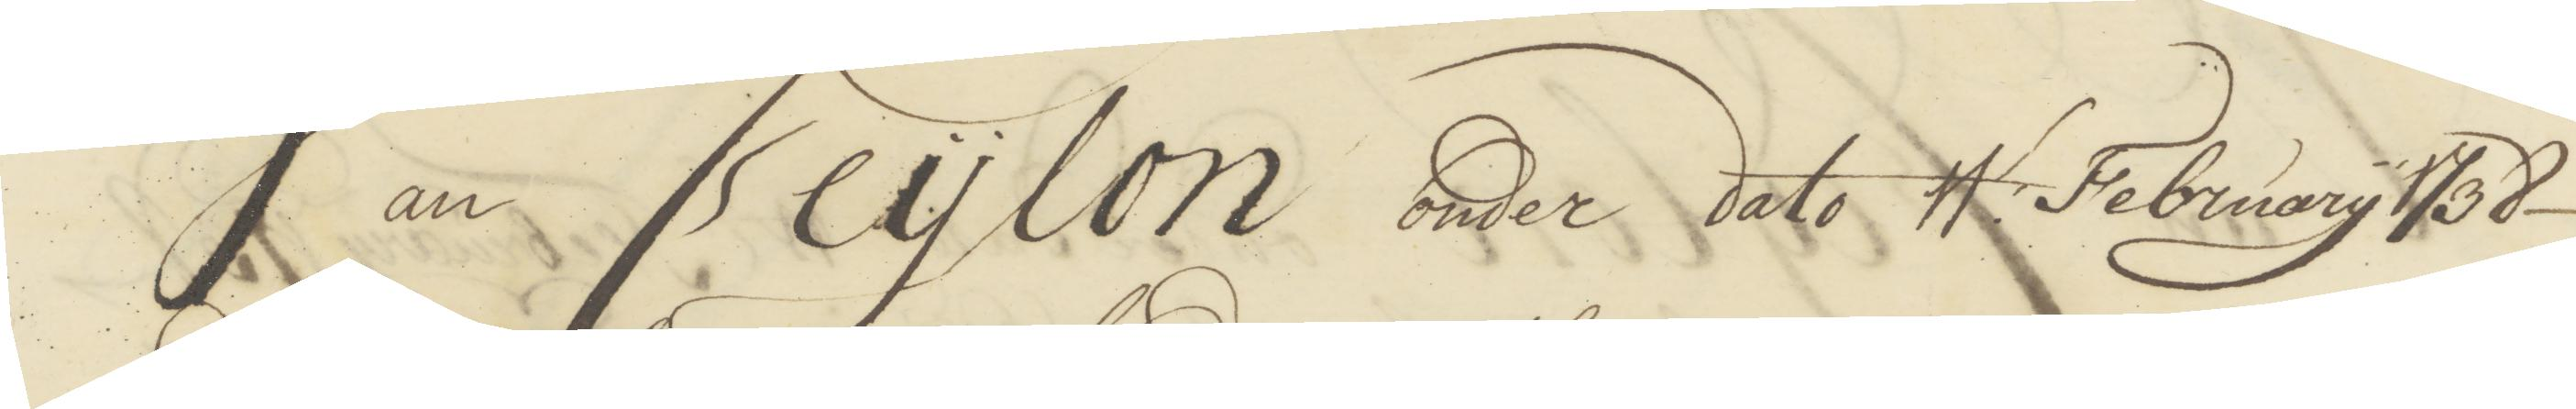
Van Ceijlon onder dato 11:' Februarij 1738—
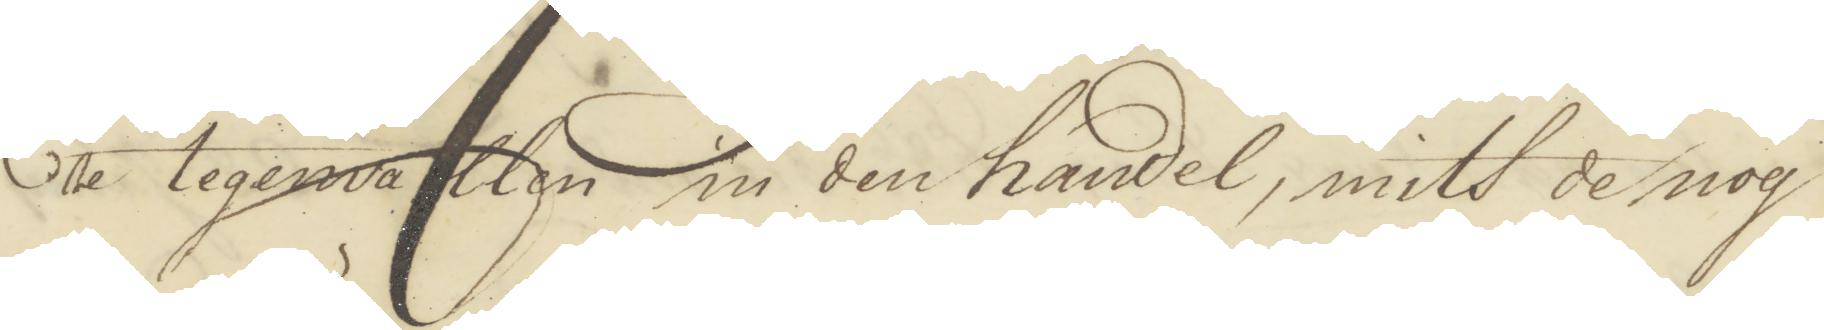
de tegenvallen in den handel, mits de nog
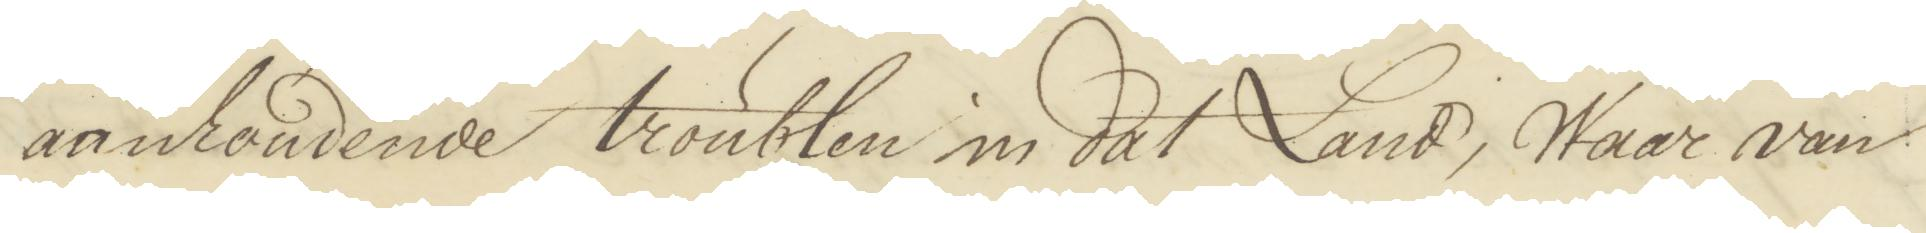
aanhoudende troublen in dat Land, Waar van
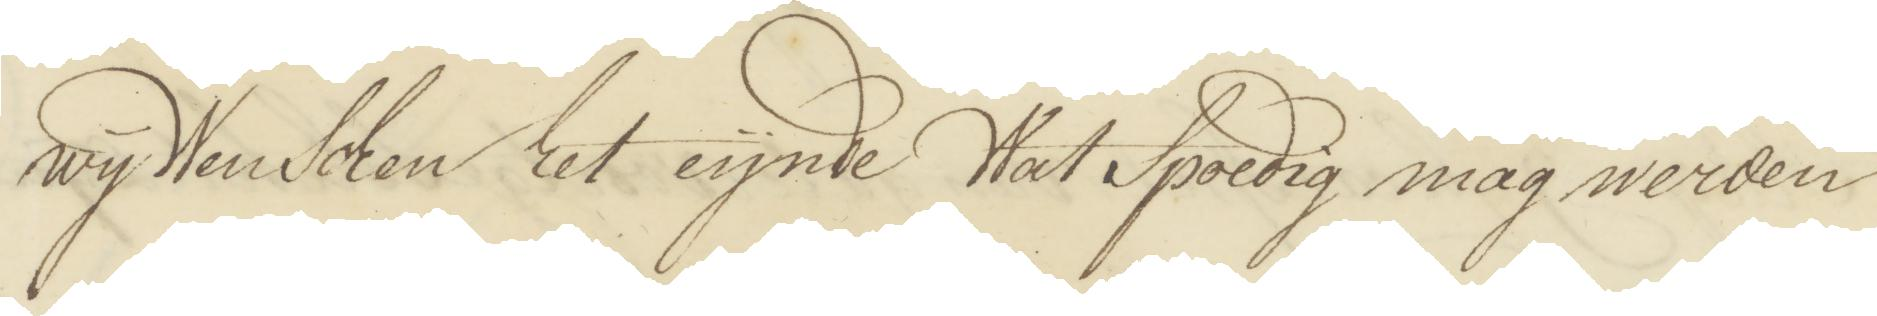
wij Wenschen het eijnde Wat spoedig mag werden
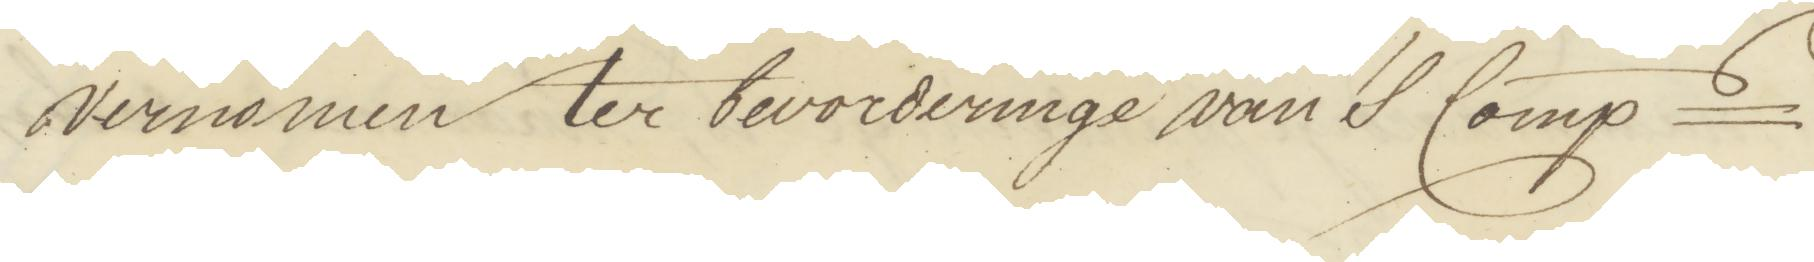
vernomen ter bevorderinge van ’s Comp=s
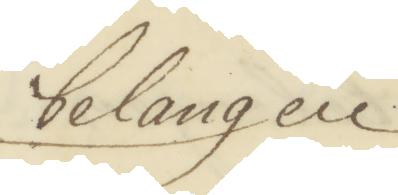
belangen
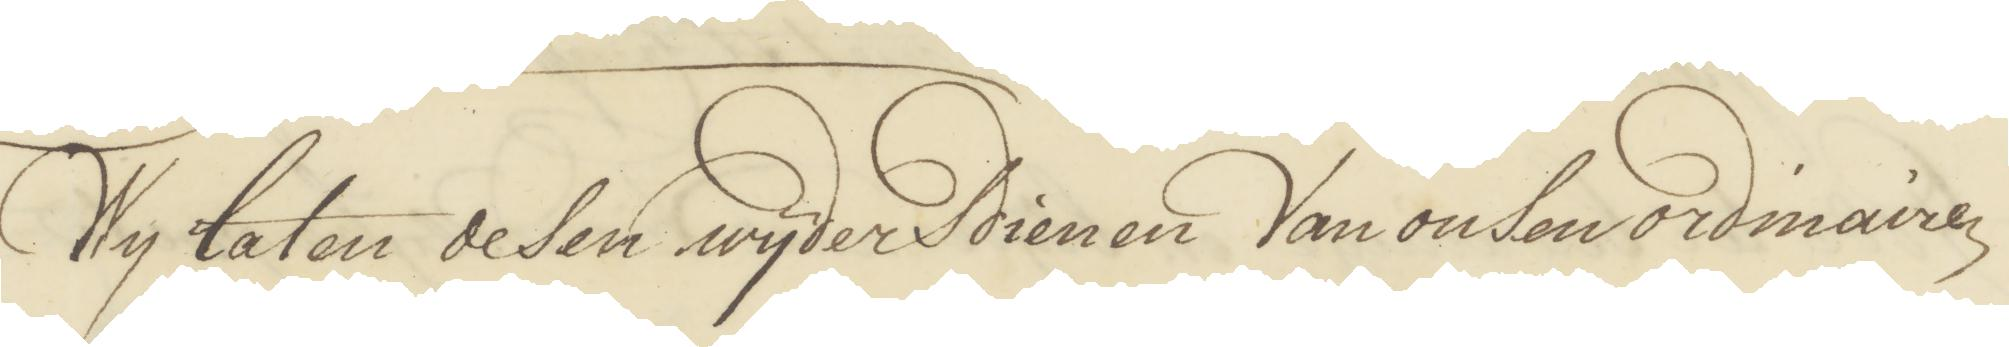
Wy laten desen wijders dienen Van onsen ordinairen
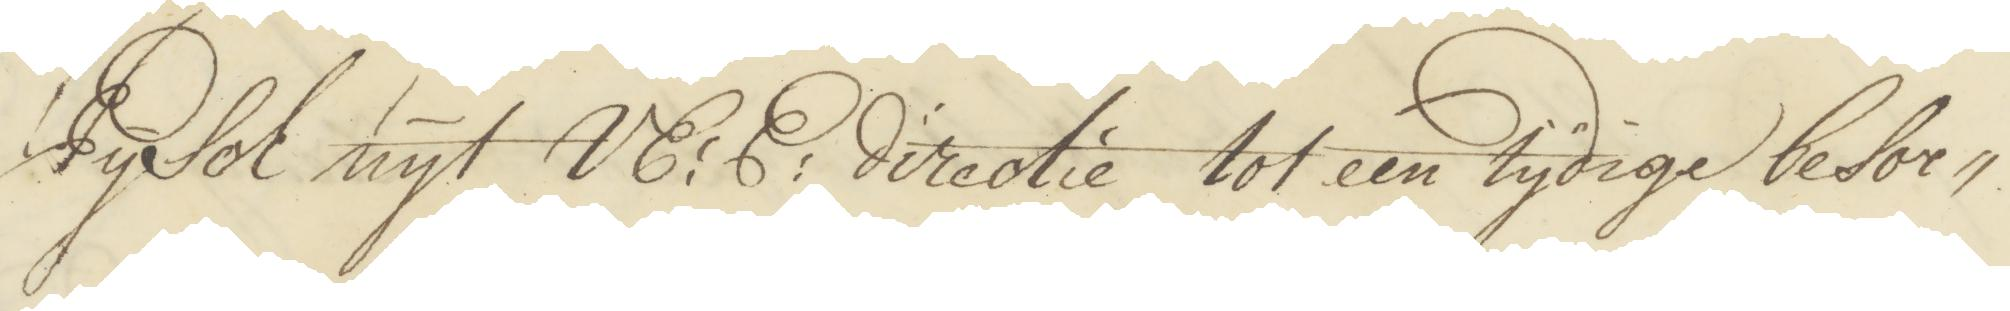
Eijsch uijt VE: E: directie tot een tijdige besor„
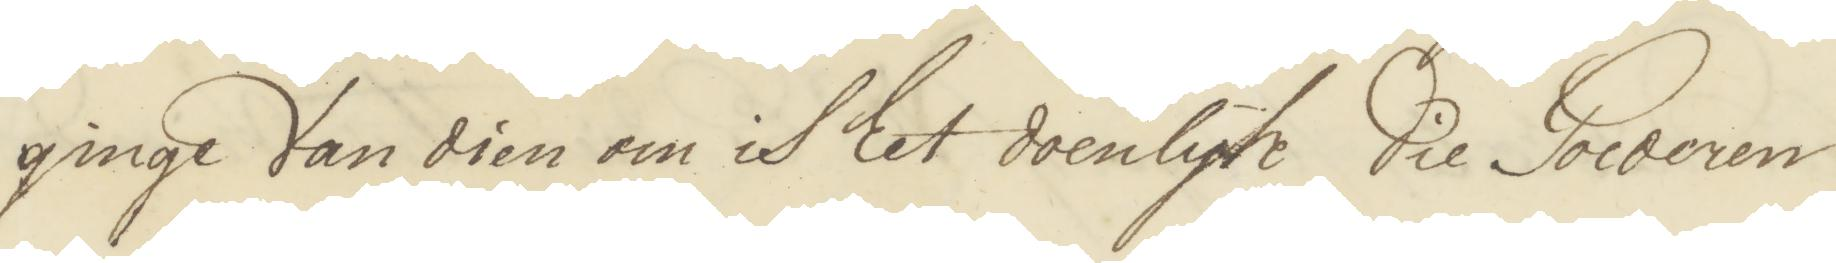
ginge Van dien om is het doenlijk die Goederen
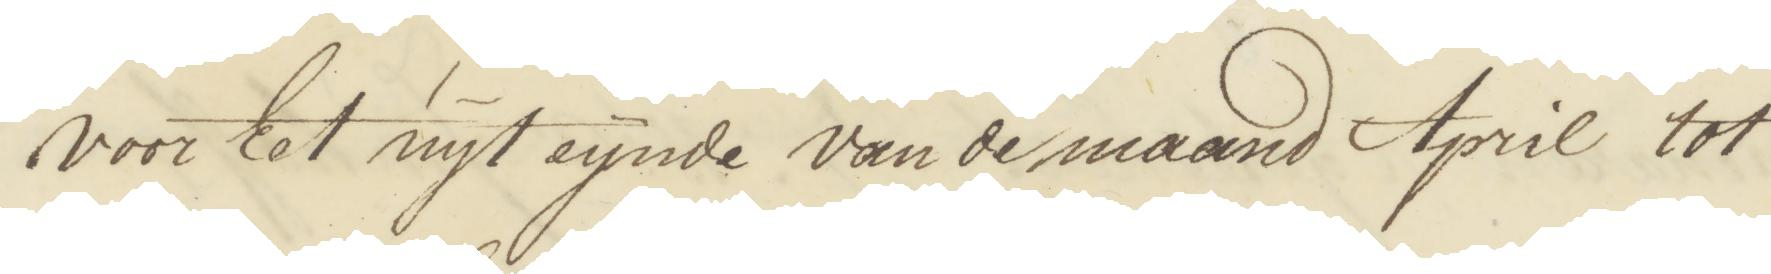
voor het uijteijnde van de maand April tot
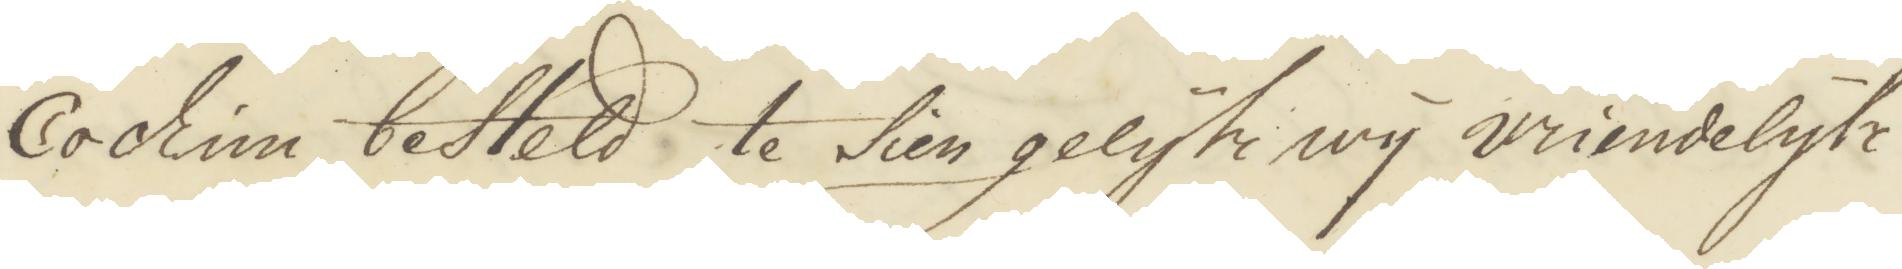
Cochim besteld te sien gelijk wij vriendelijk
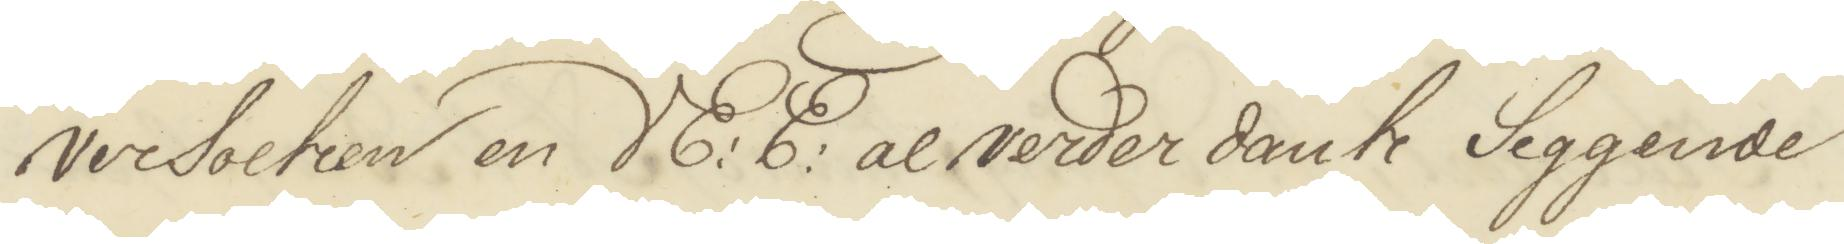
versoeken en VE: E: al verder dank seggende
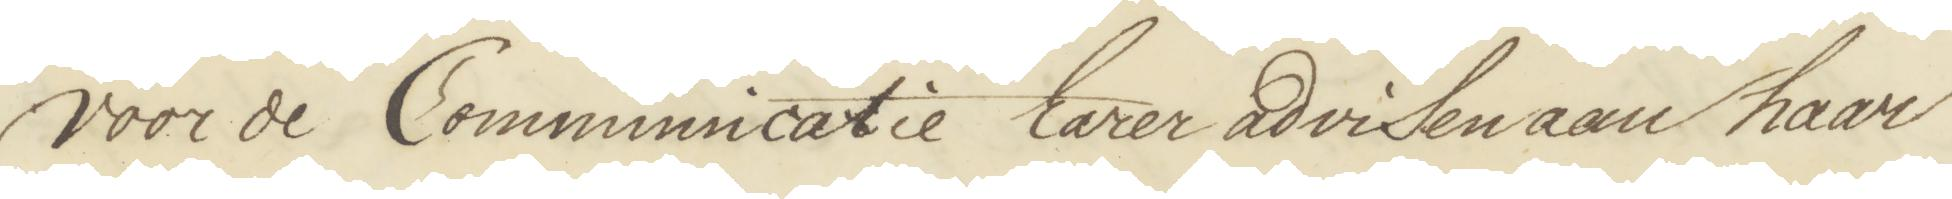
voor de Communicatie harer advisen aan haar
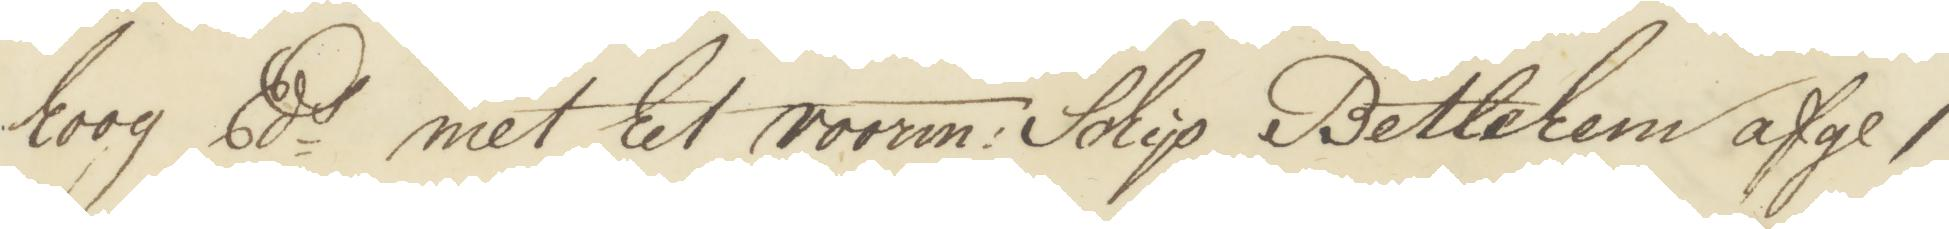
hoog Ed=s met het voorm: schip Betlehem afge,
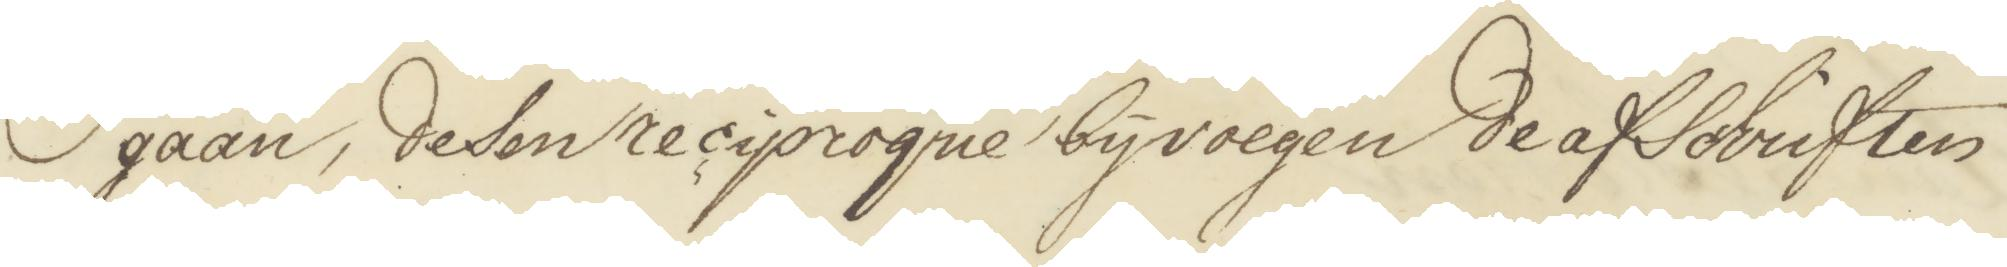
gaan, desen reciproque bijvoegen de afschriften
